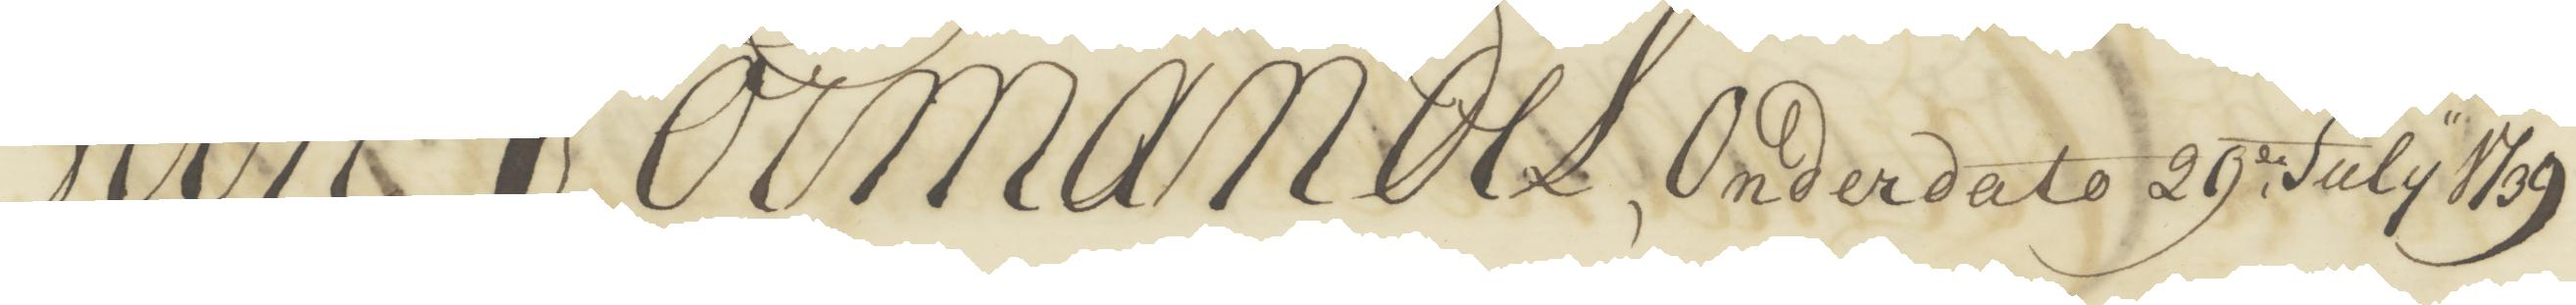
Van Cormandel, Onder dato 29„en Iulij 1739
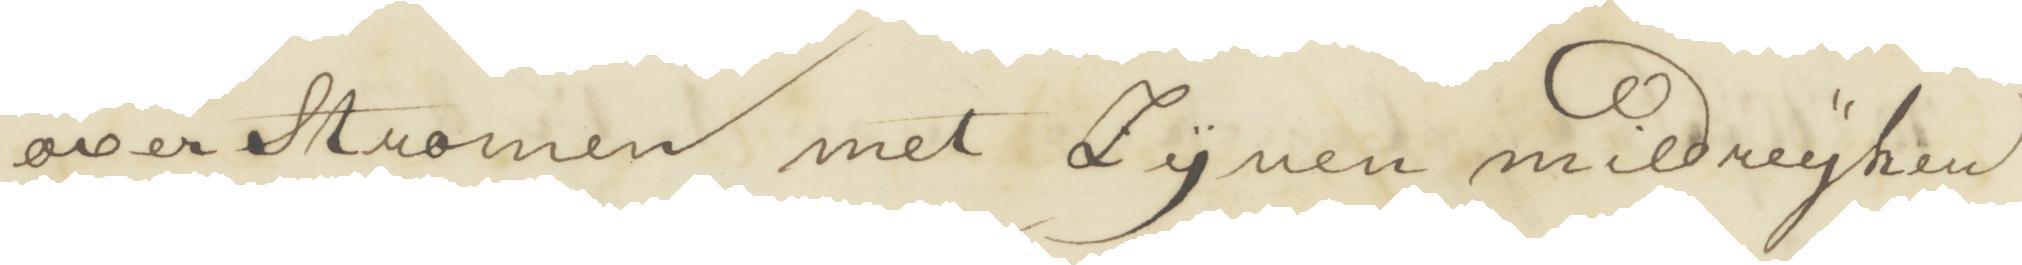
overstromen met Zijnen mildreijken
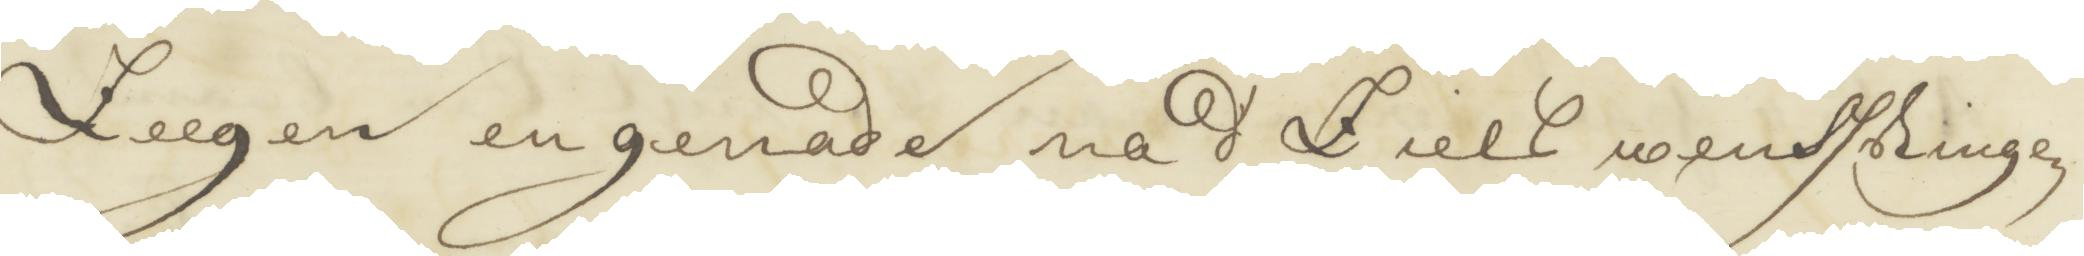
Zeegen en genade na d' Ziels wensschingen
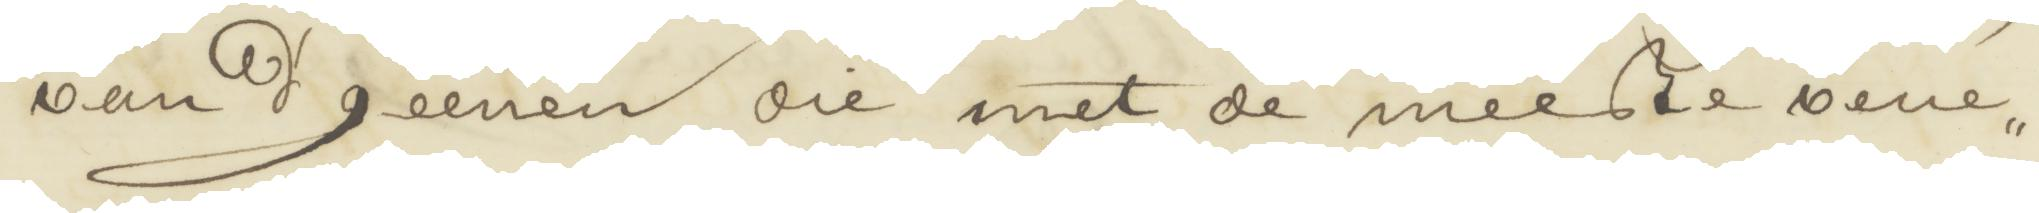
van d' geenen, die met de meeste vene„
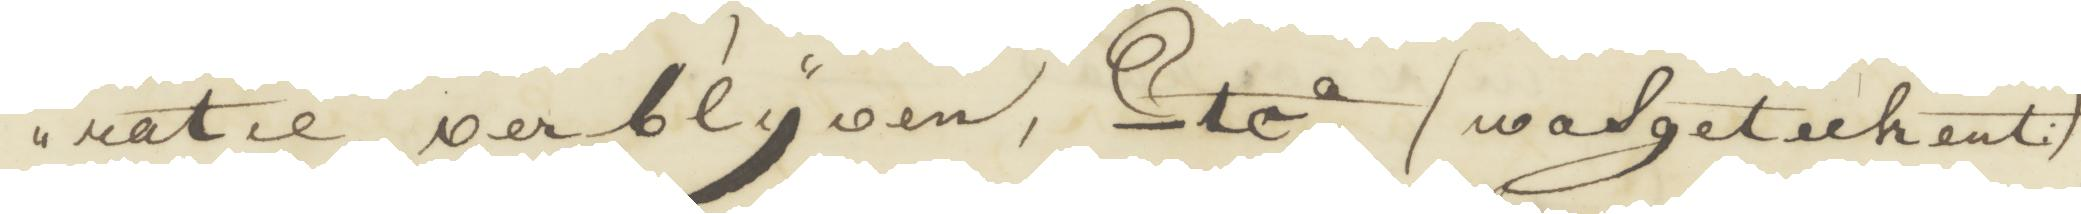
„ratie verblijven, Etc„a / was geteekent:/
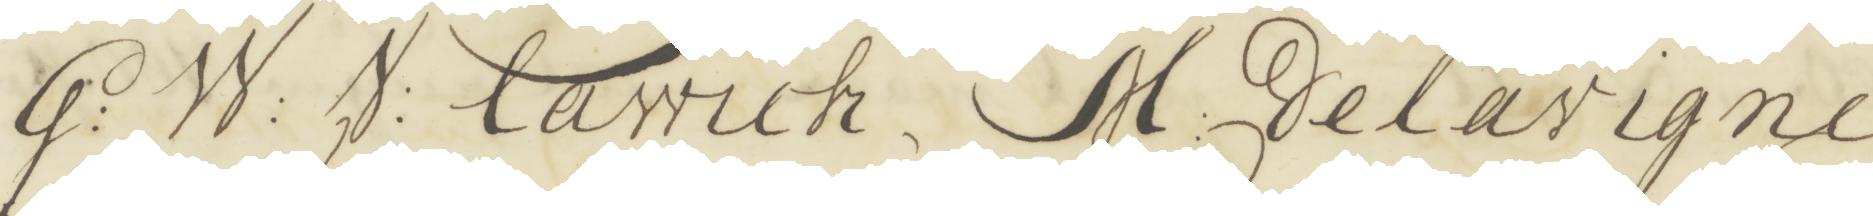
G: W: V: lawick M: de lavigne
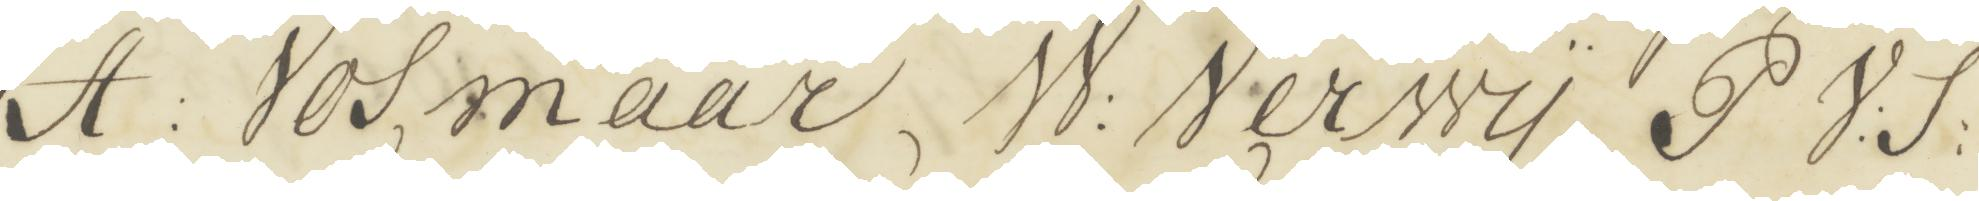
A: Vosmaar, W: Verwij, P V: S:
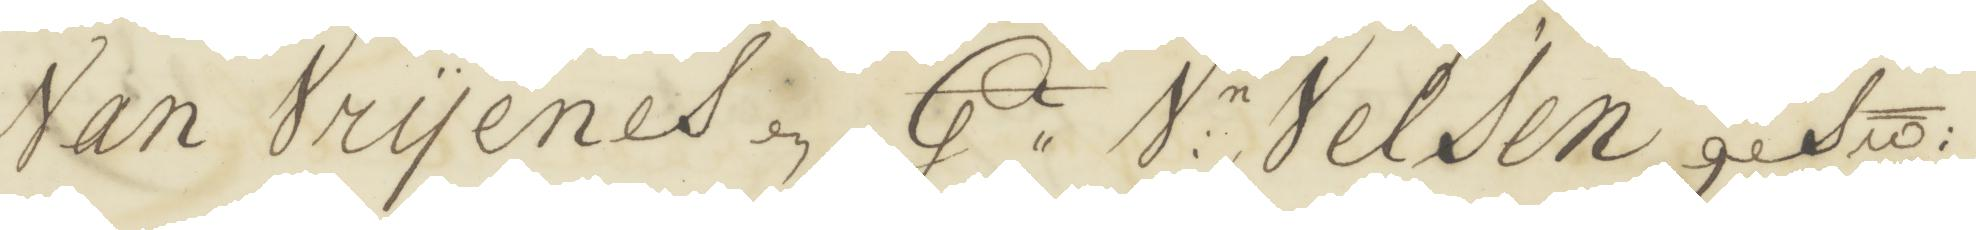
Van Vrijenes en G„t V:n Velsen gesw:
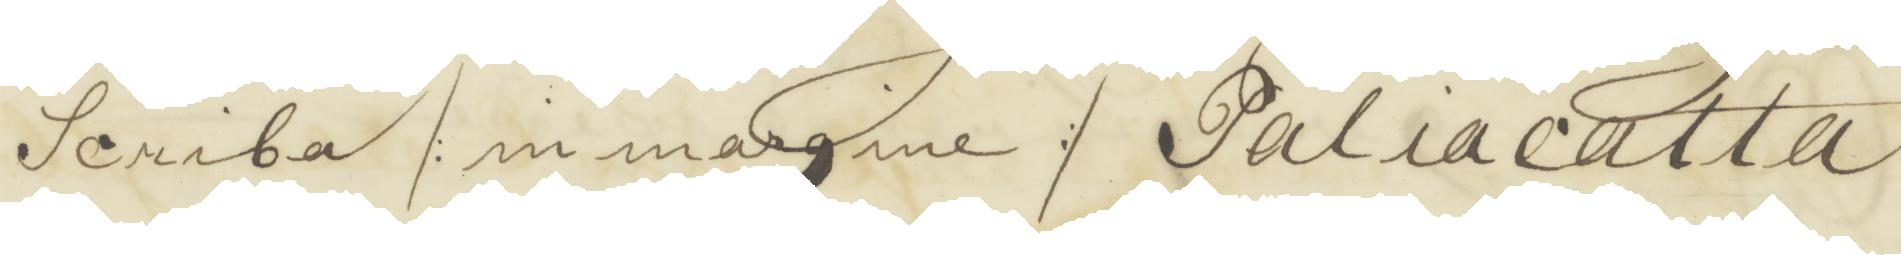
scriba /:in margine :/ Paliacatta
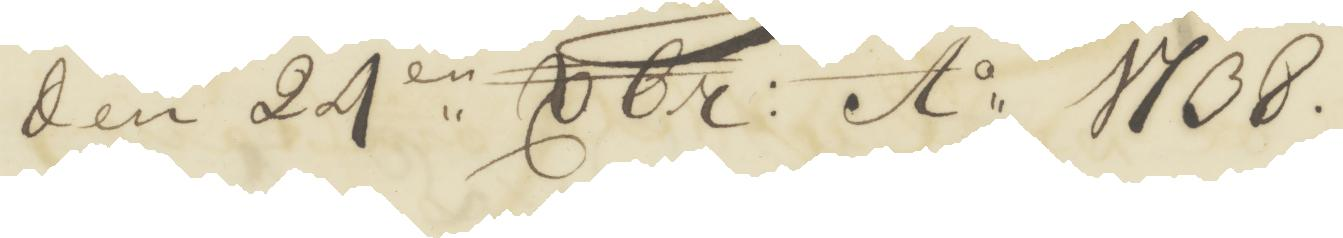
den 24„en xbr: A„o 1738. —
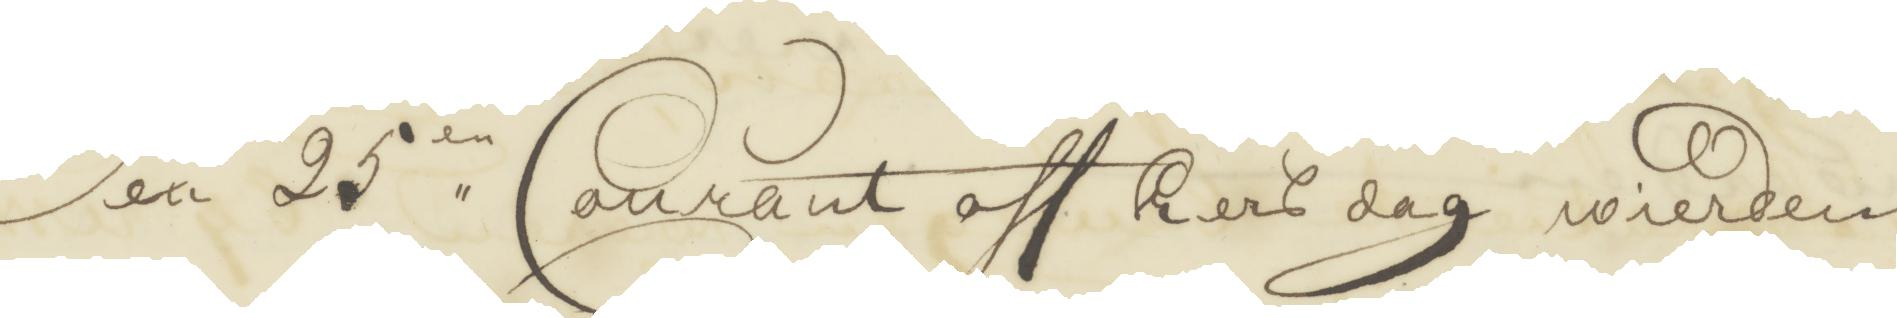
Den 25„en Courant off kers dag wierden
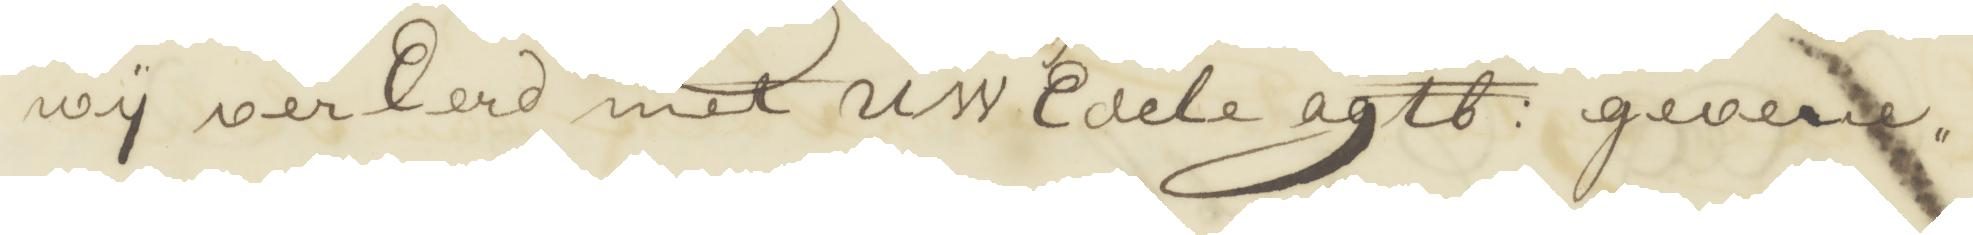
wij vereerd met uw Edele agtb: gevene„
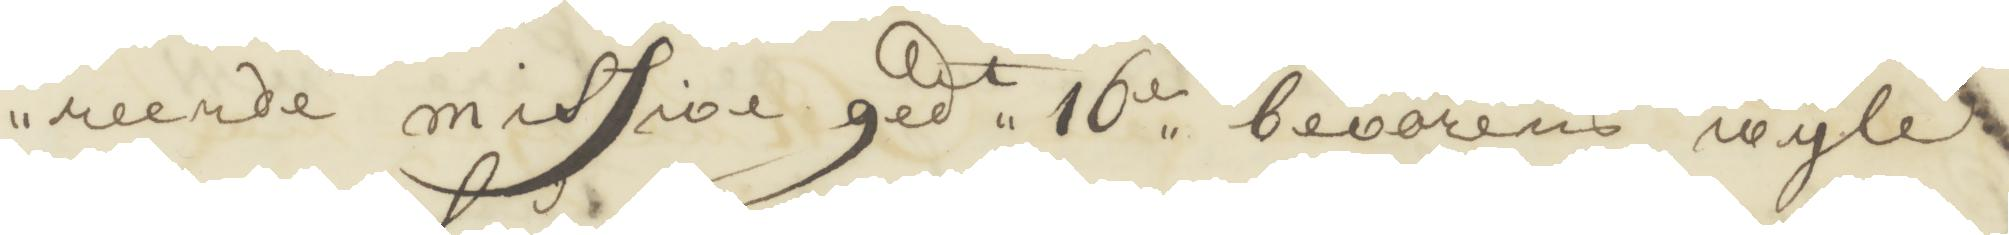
„reerde missive ged„t 16„e bevorens wijle
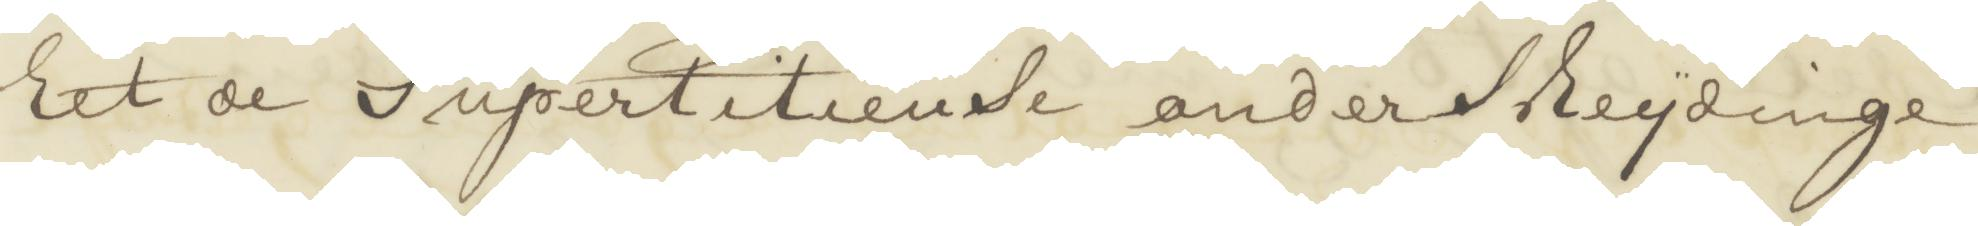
het de supertitieuse onderscheijdinge
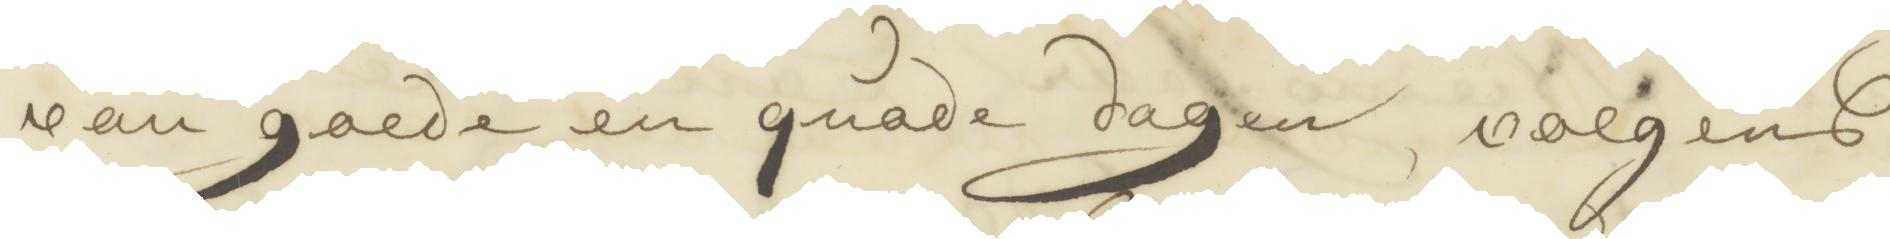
van goede en quade dagen volgens
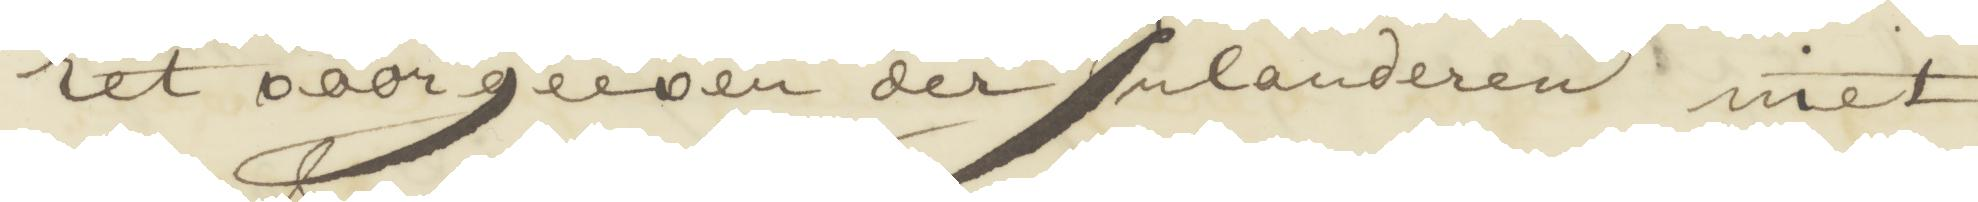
het voor geeven der Inlanderen niet
